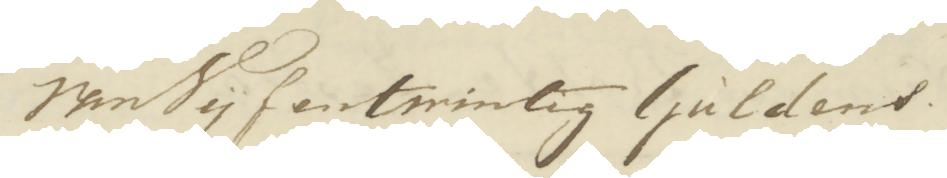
van Vijf en twintig Guldens.
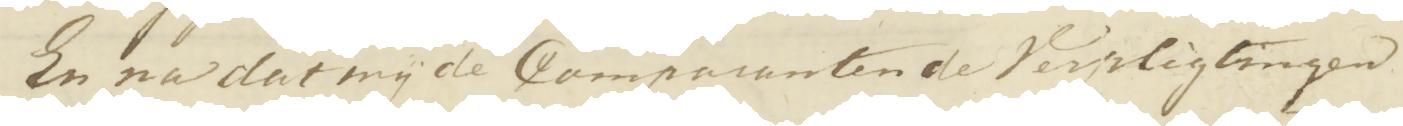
En na dat mij de Comparanten de Verpligtingen
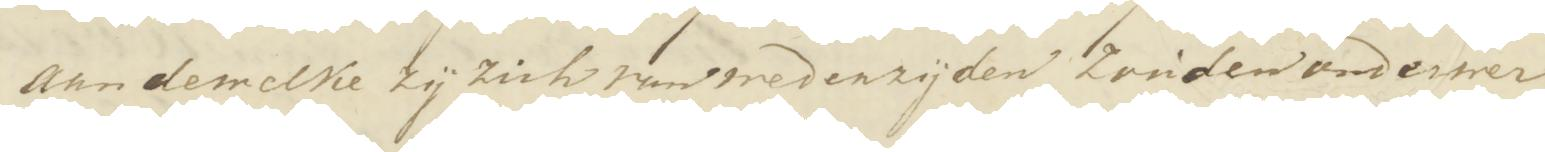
aan de welke zij zich van wederzijden zouden onderwer
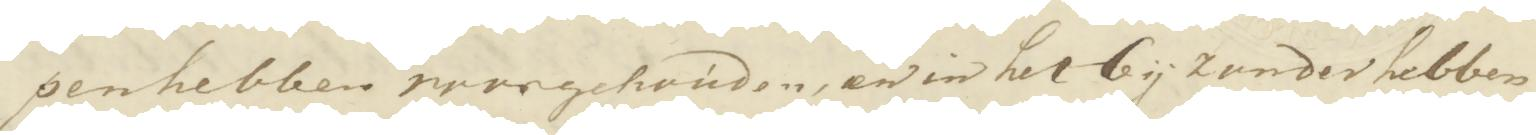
pen hebben voorgehouden, en in het bij zonder hebben
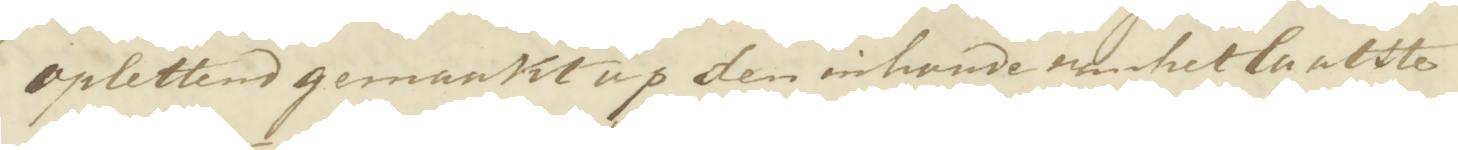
oplettend gemaakt op den inhoude van het laatste
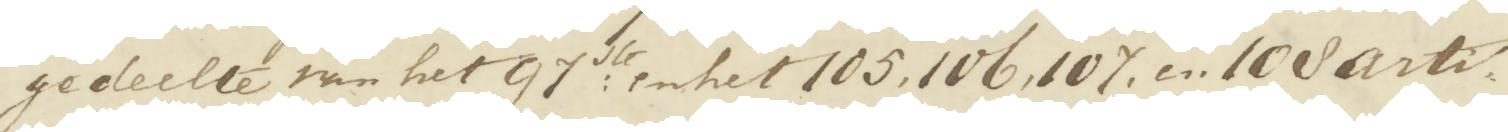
gedeelte van het 97:ste en het 105, 106, 107, en 108 arti„
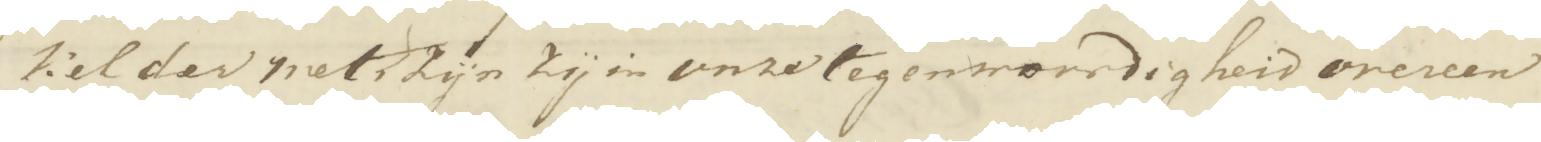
kel der wet, zijn zij in onze tegenworrdigheid overeen
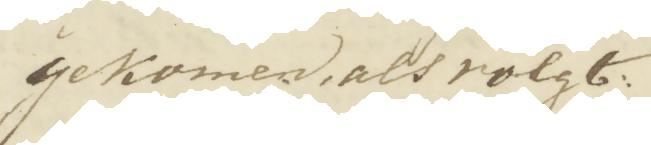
gekomen, als volgt:
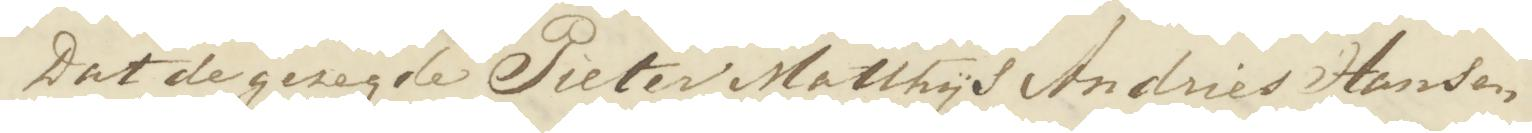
dat de gezegde Pieter Matthijs Andries Hansen
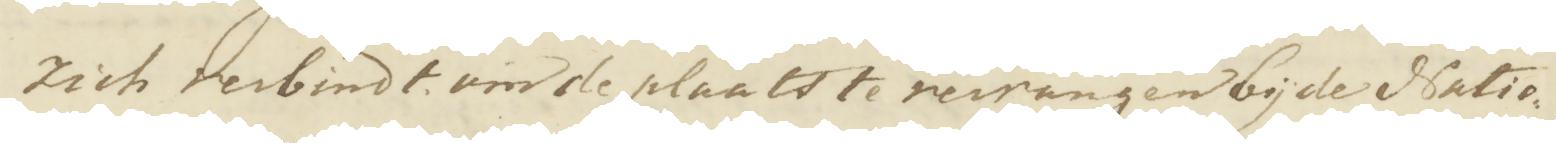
zich verbindt om de plaats te vervangen bij de Natio„
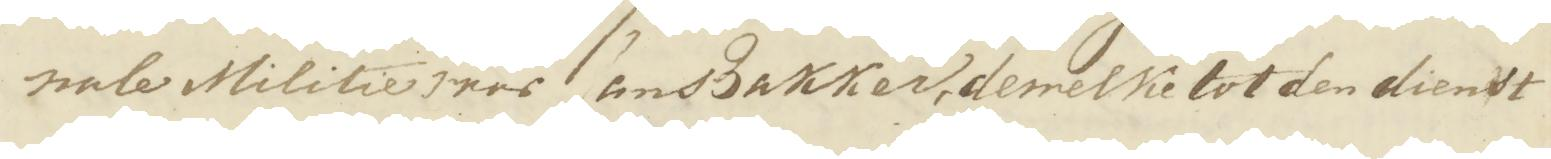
nale Militie voor Jans Bakker, dewelke tot den dienst
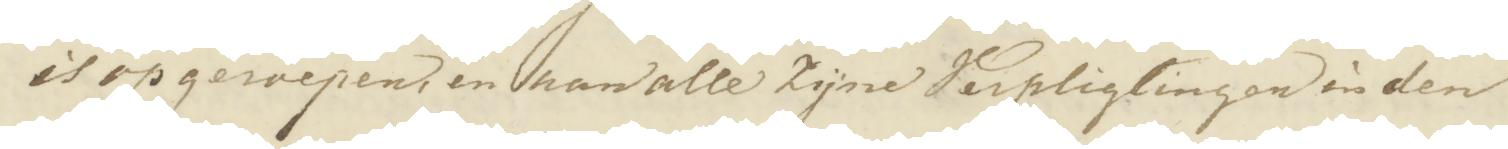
is op geroepen, en aan alle zijne Verpligtingen in den
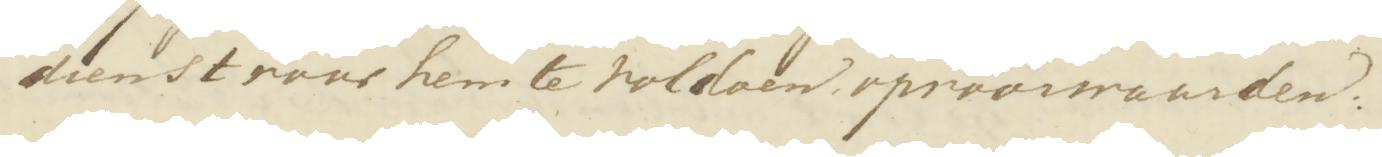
dienst voor hem te voldoen, op voorwaarden:
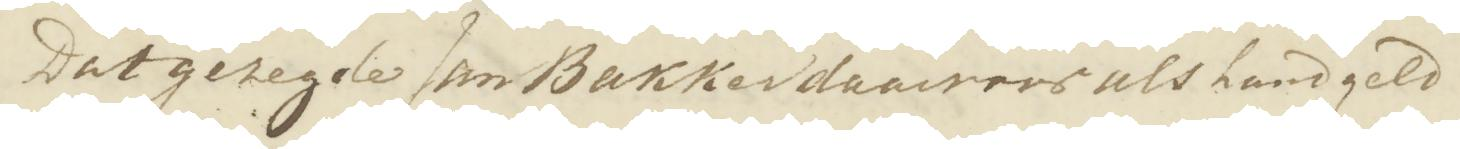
Dat gezegde Jan Bakker daarvoor als handgeld
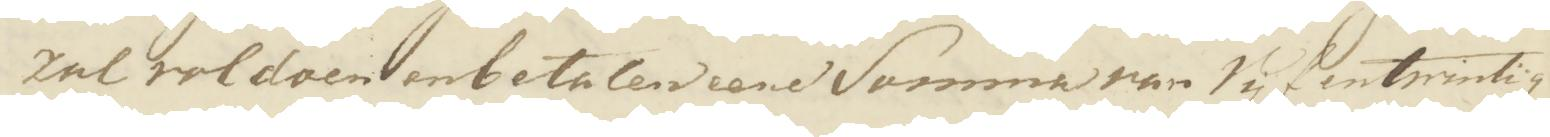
zal voldoen en betalen eene Somma van Vijf en Twintig
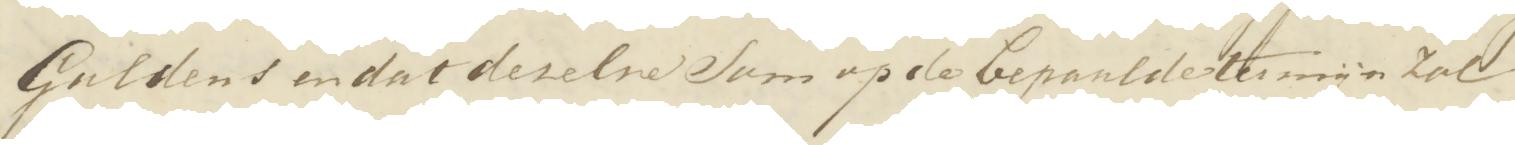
Guldens en dat dezelve Som op de bepaalde termijn zal
